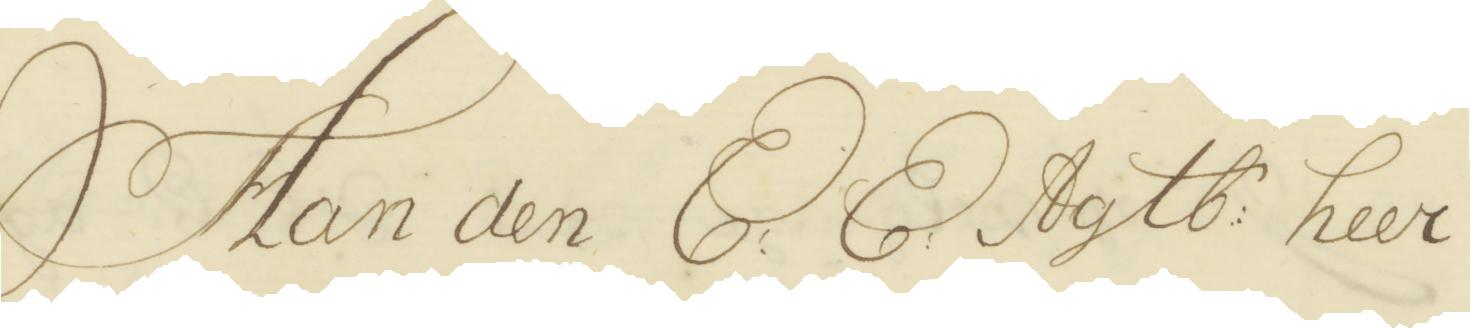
Aan den E: E: Agtb: heer
